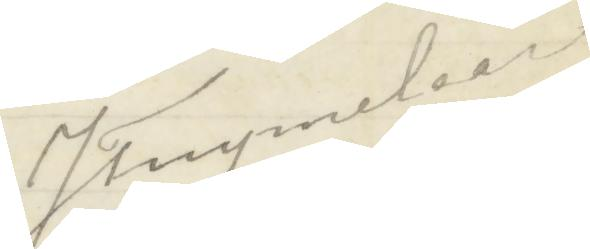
JTuymelaar
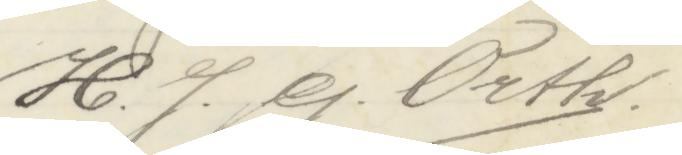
H. J. G. Orth.
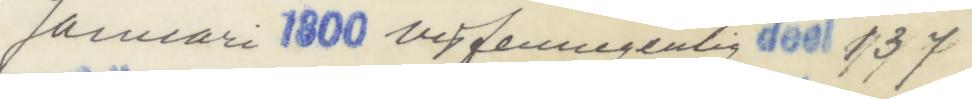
Januari 1800 vyfennegentig deel 137
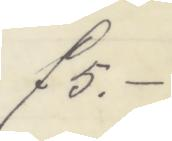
ƒ 5.—
